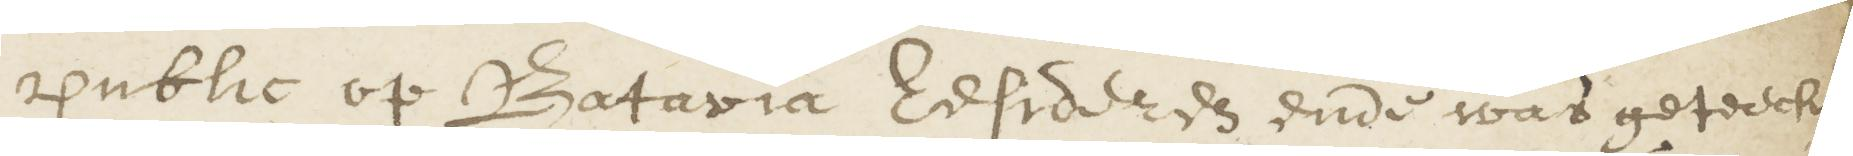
public op Batavia resideren ende was geteeckt
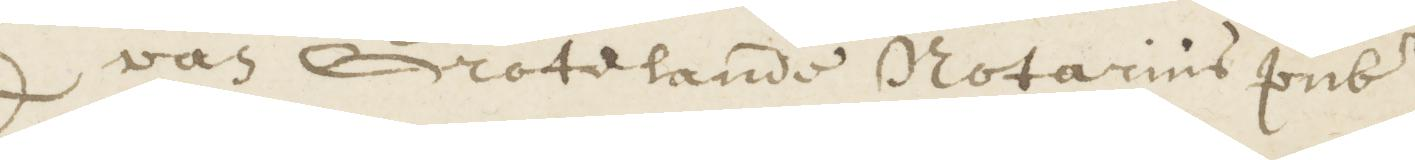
G van Grotelande Notarius pubs
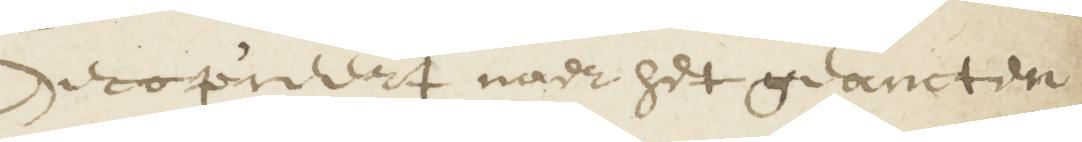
Gecopieert naer het geancten
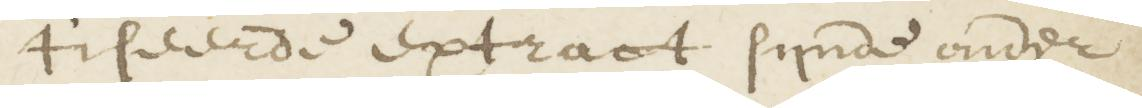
tiseerde extract synde onder
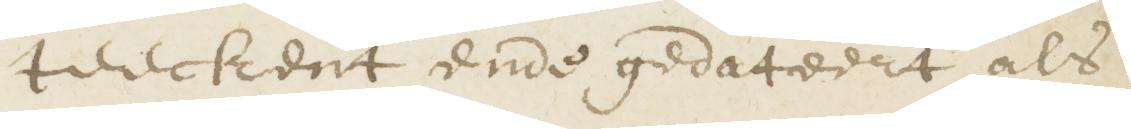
teeckent ende gedateert als
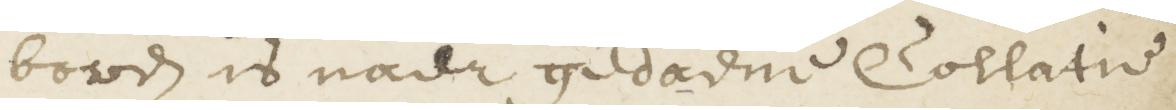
boven is naer gedaene Collatie
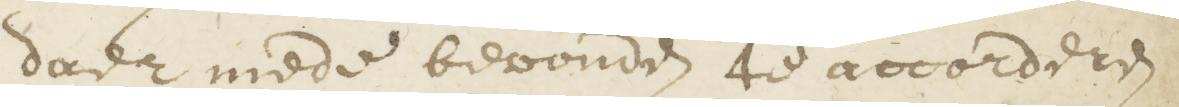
daer mede bevonden te accorderen
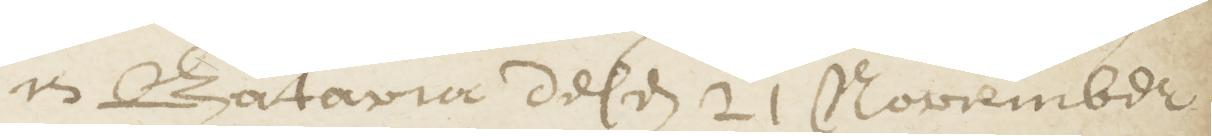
in Batavia desen 21 November
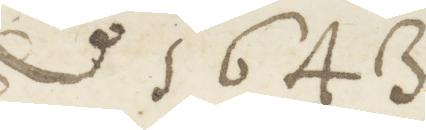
Ao 1643
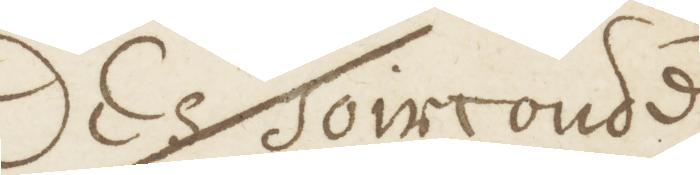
Des Toirtonde
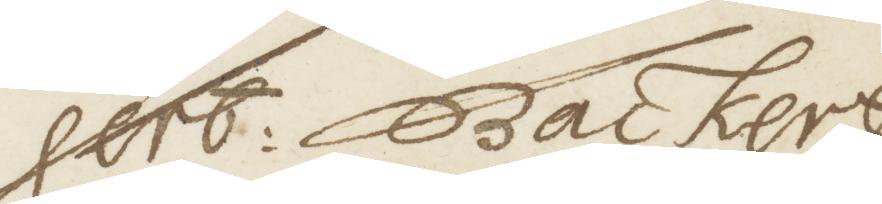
gerb: Backer
